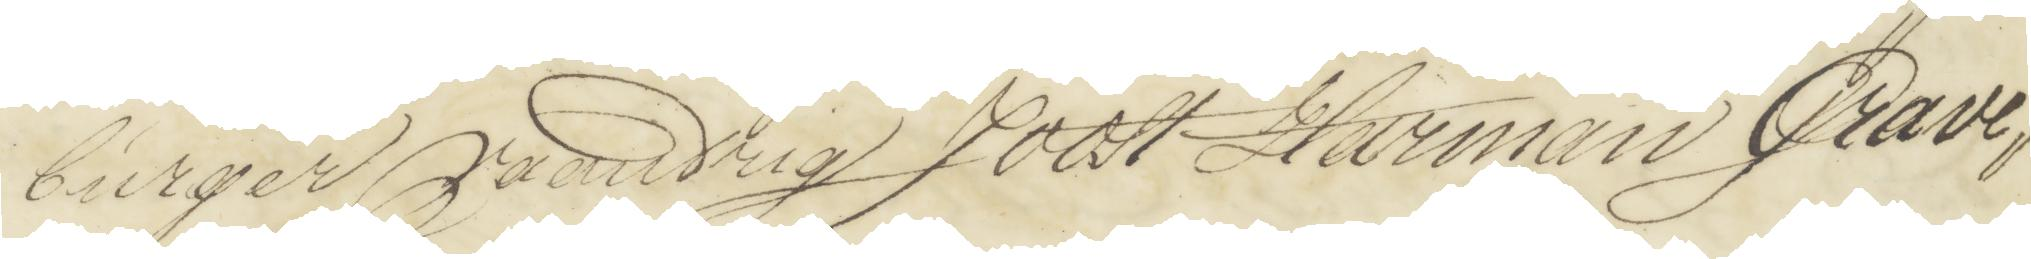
burger vaandrig Joost Herman Grave„
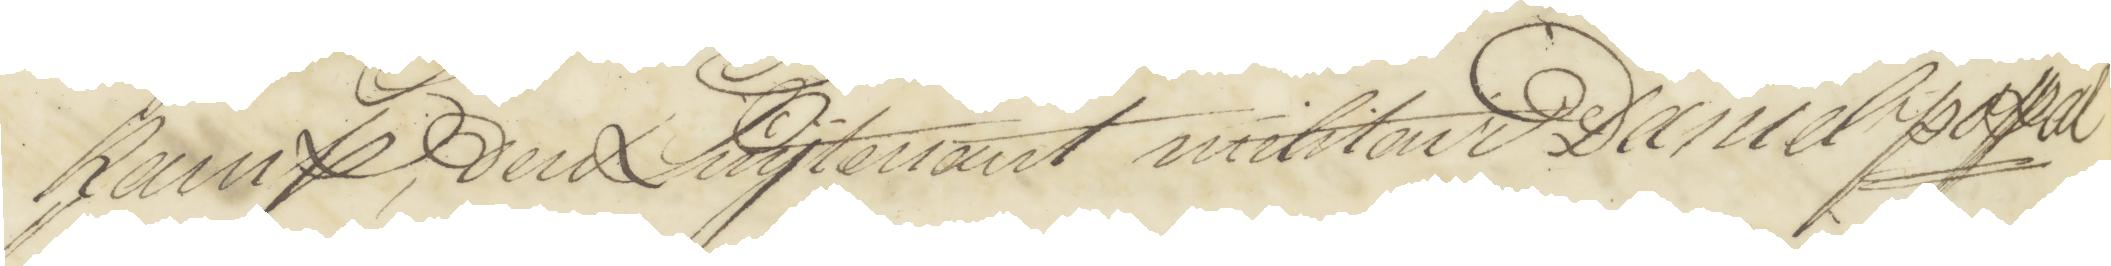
kamp, den Luijtenant militair Daniel poppal
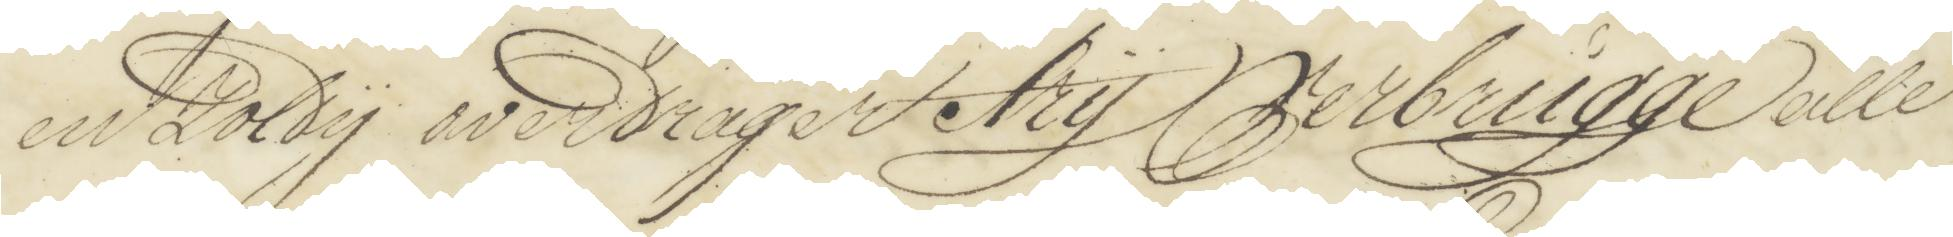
en zoldij overdrager Arij Verbrugge alle
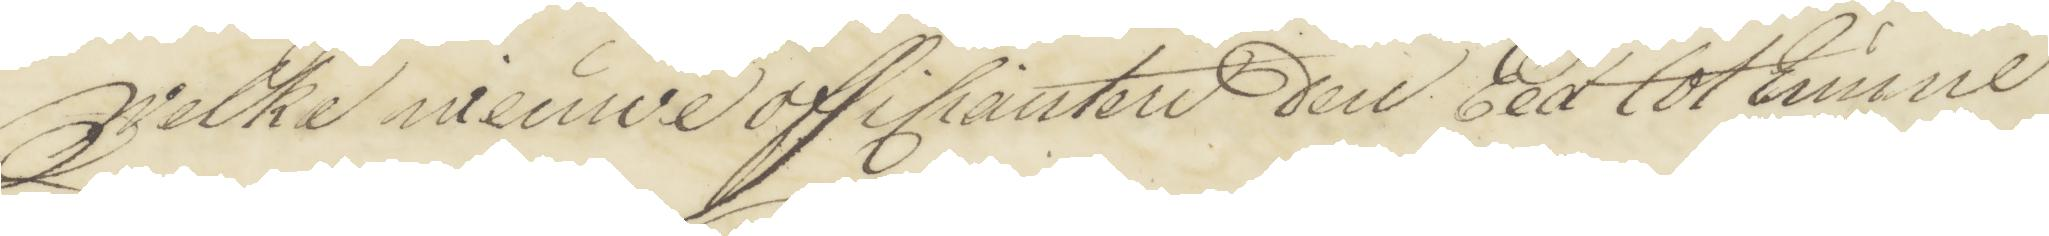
welke nieuwe officianten den Eed tot hunne
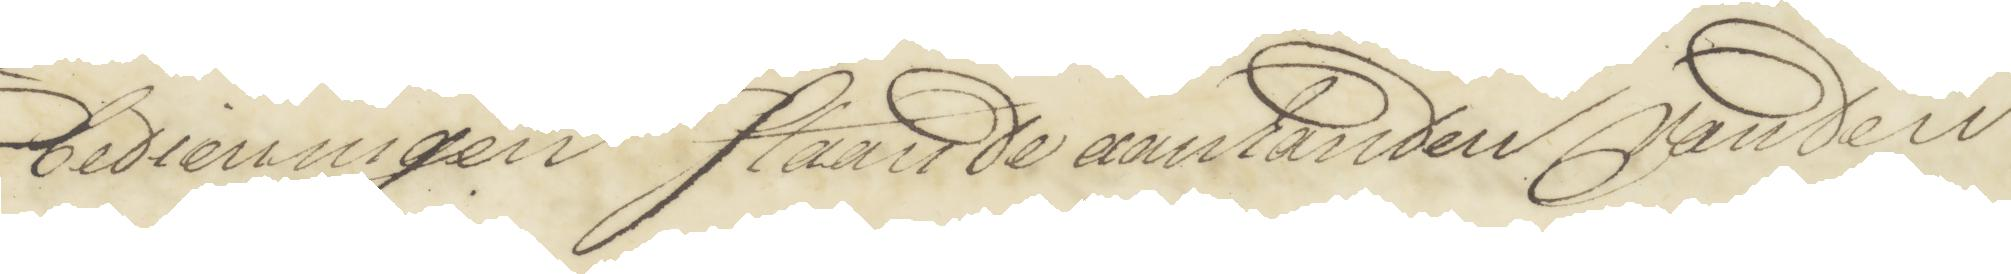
bedieningen staande aanhanden van den
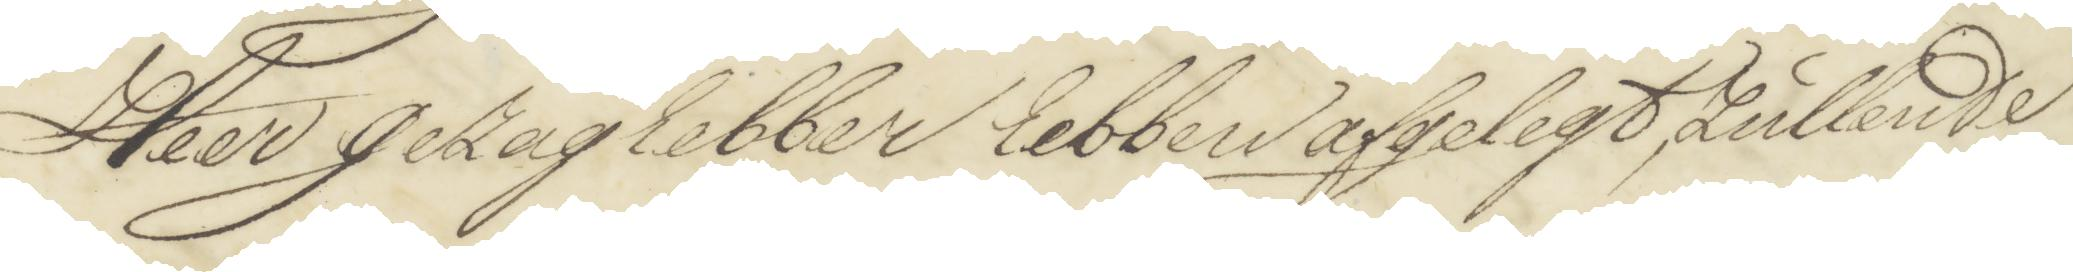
Heer gezaghebber hebben afgelegt, zullende
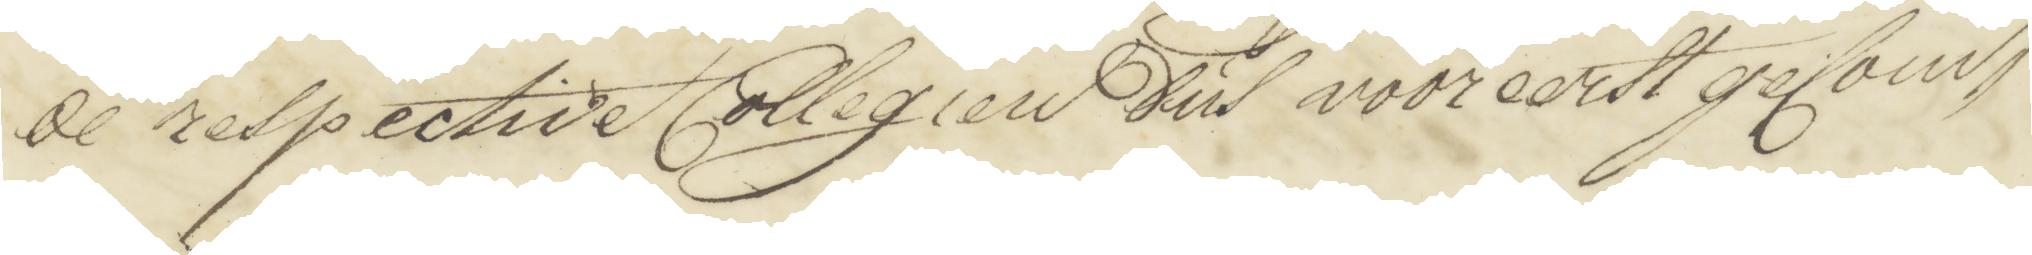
de respective collegien dus vooreerst gecom„
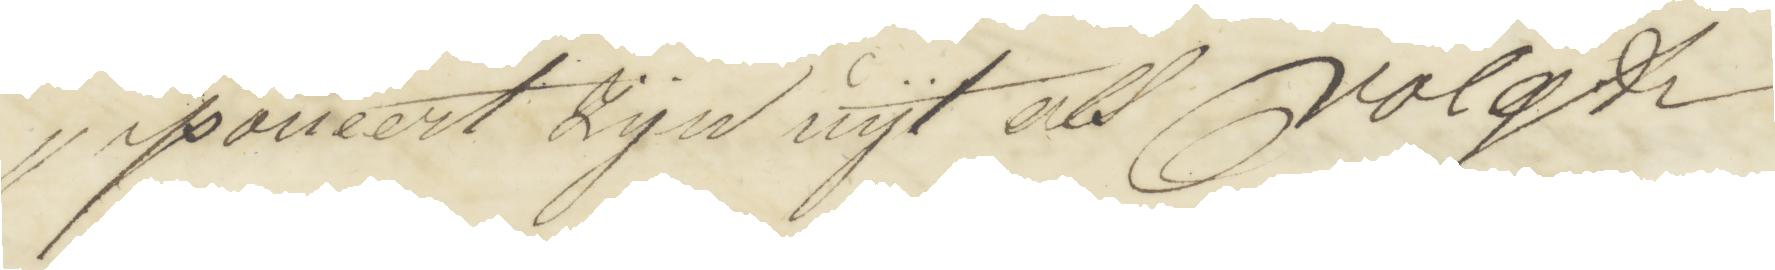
„poneert zijn uijt als volgt
